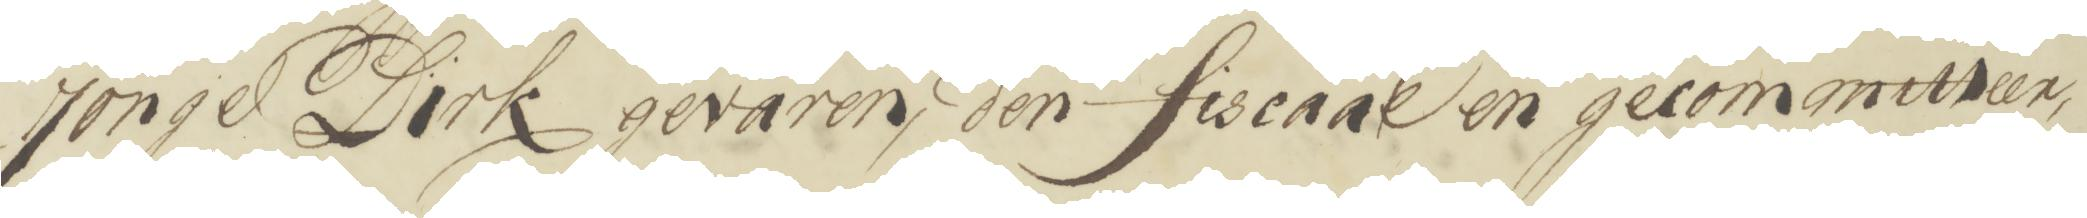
Jonge Dirk gevaren, den fiscaal en gecommitteer„
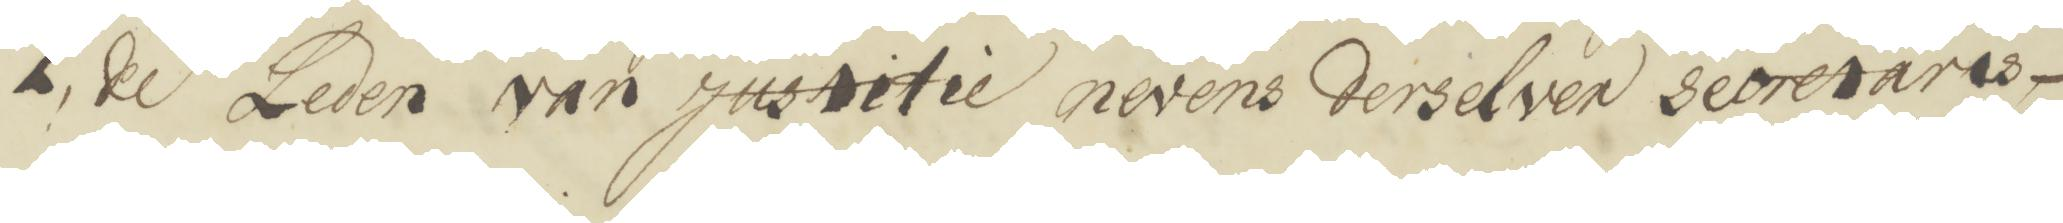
„de Leden van Justitie nevens derzelver secretaris,
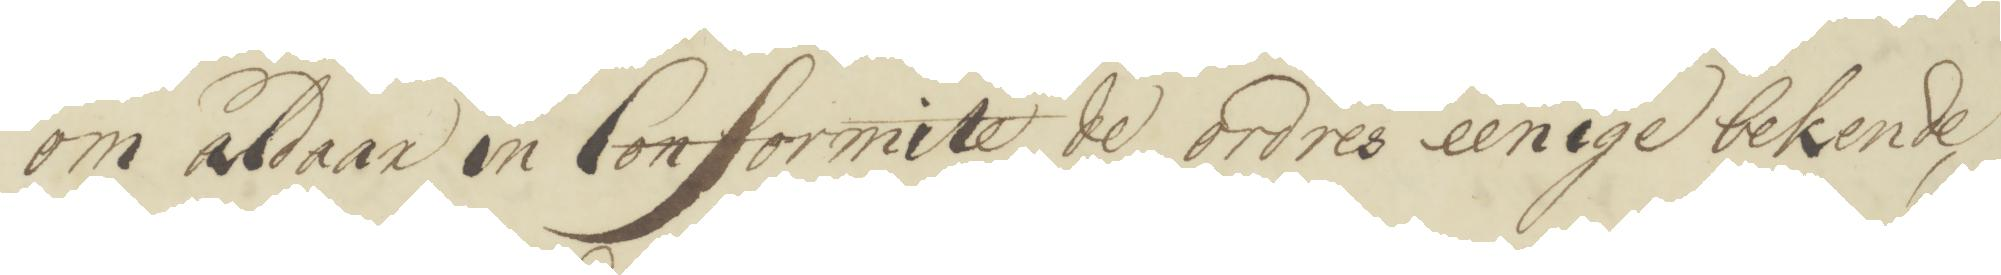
om aldaar in Conformite de ordres eenige bekende,
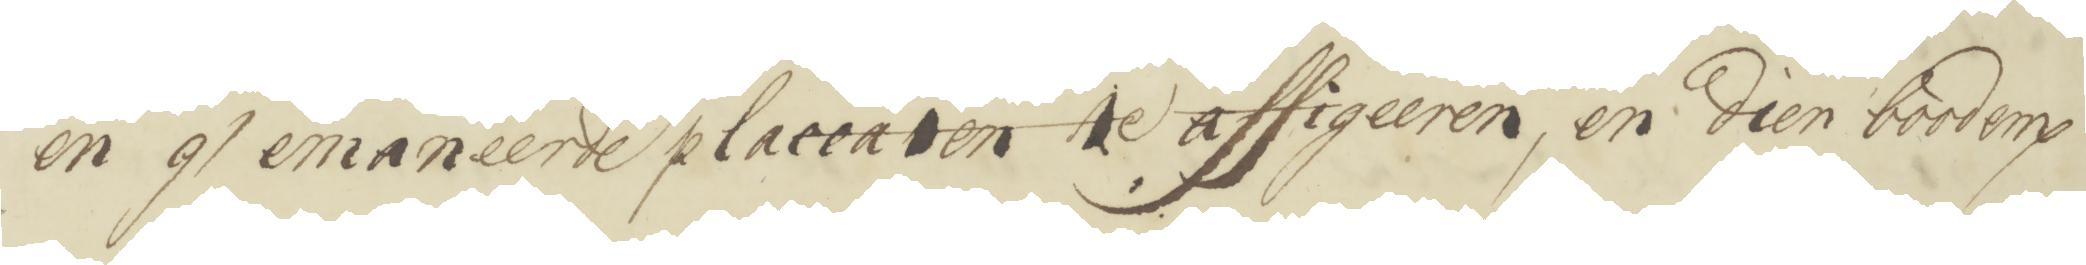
en g’emaneerde placcaten te affigeeren, en dien boodem
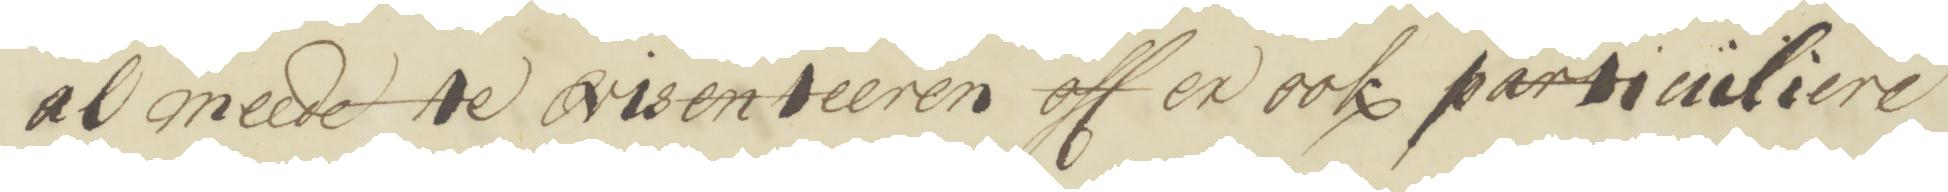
al meede te visenteeren off er ook particuliere
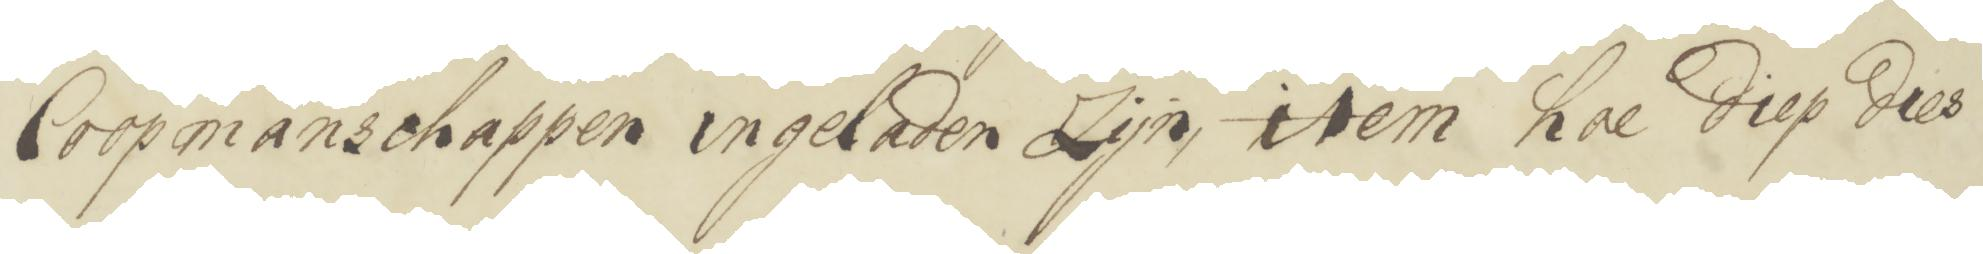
Coopmanschappen ingeladen zijn, item hoe diep dies
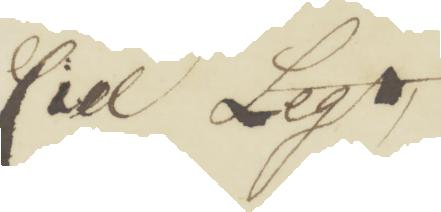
Ciel legt,
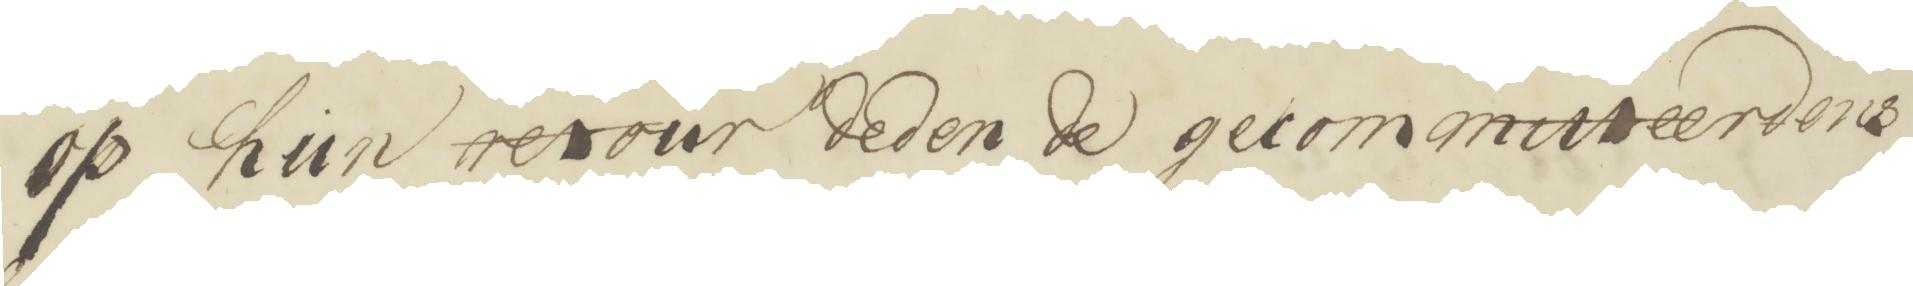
op hun retour deden de gecommitteerdens
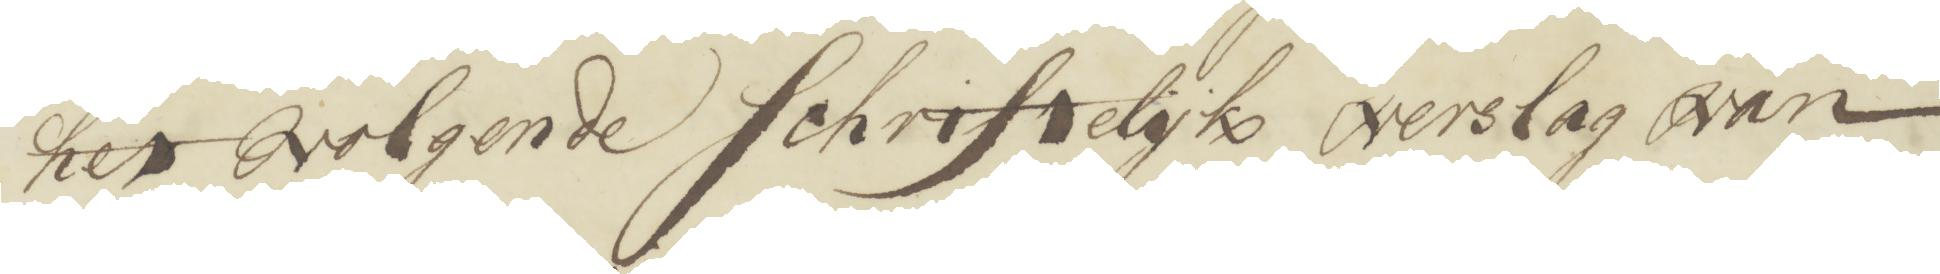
het volgende schriftelijk verslag van
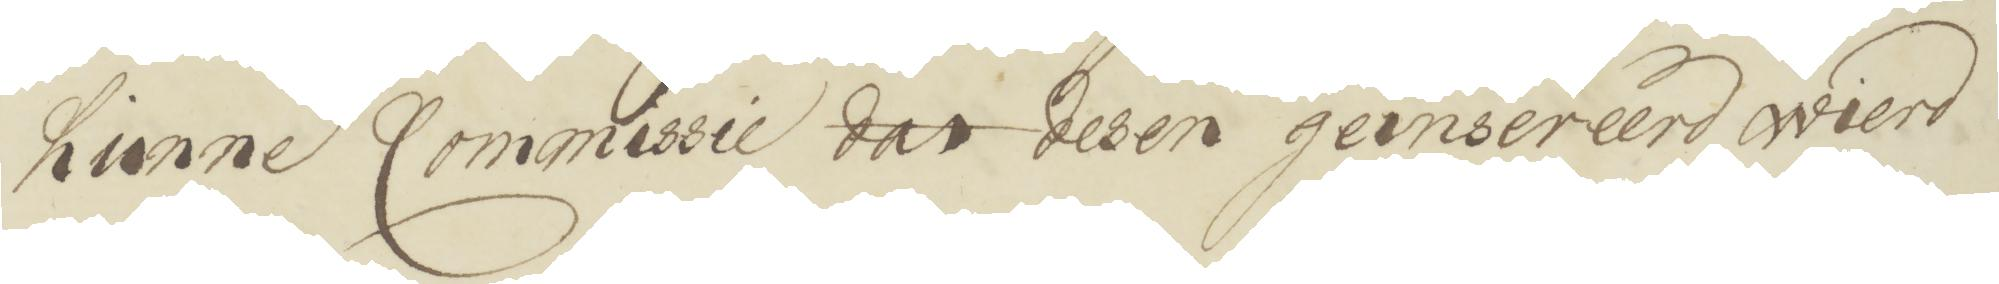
hunne Commissie dat desen geinsereerd wierd
